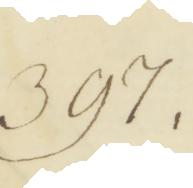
397.
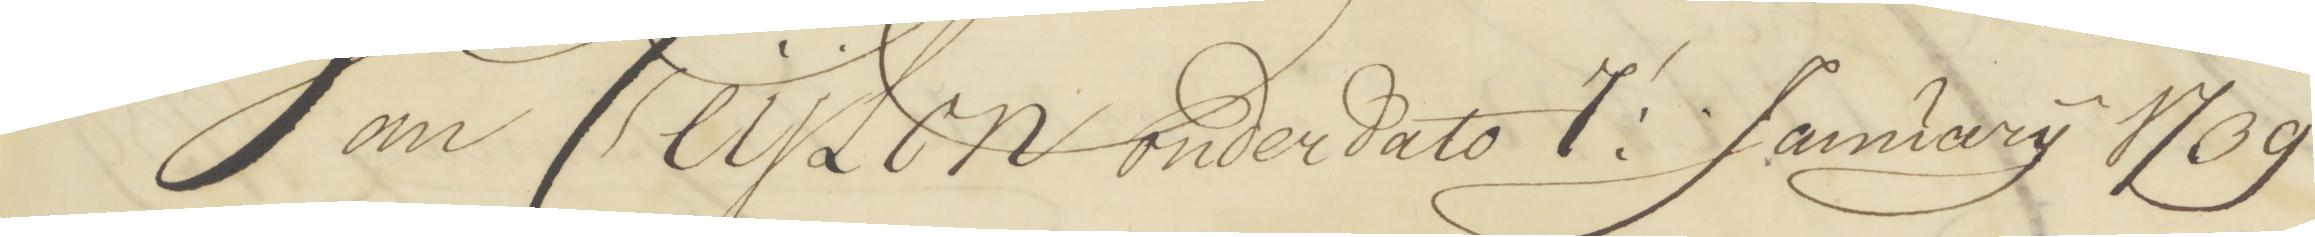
Van Ceijlon onder dato 7:' Januarij 1739
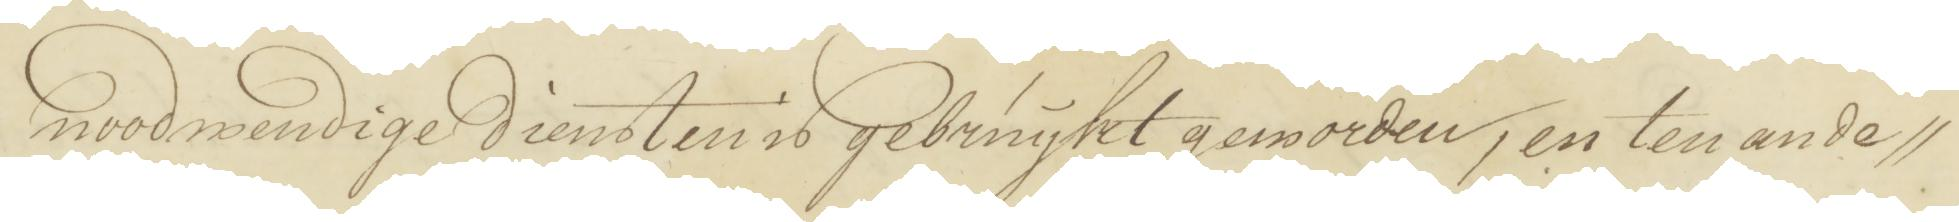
noodwendige diensten is gebruijkt geworden, en ten ande„
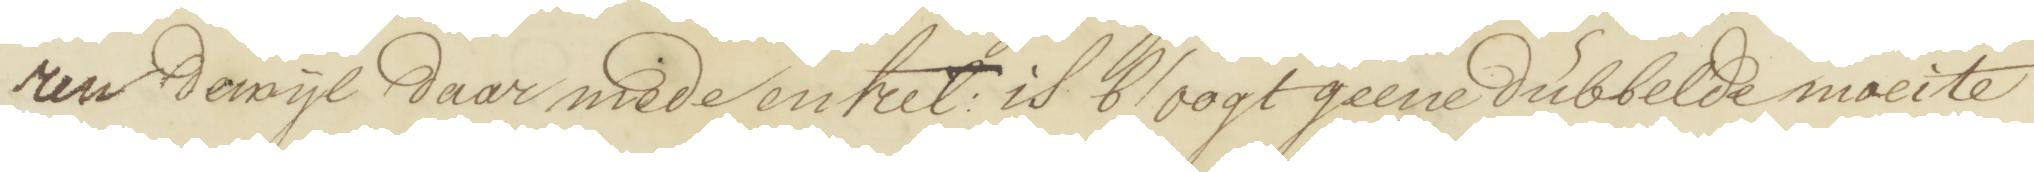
ren dewijl daar mede enkel: is boogt geene dubbelde moeite
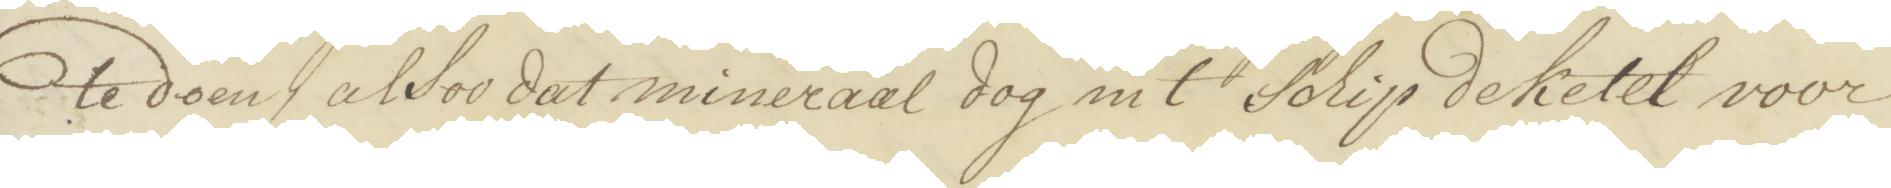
te doen, alsoo dat mineraal dog in ’t schip de ketel voor
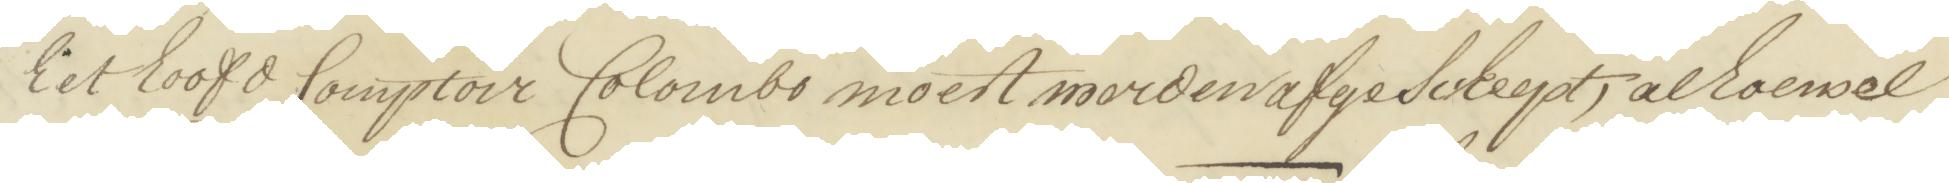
het hoofd Comptoir Colombo moest worden afgescheept, alhoewel
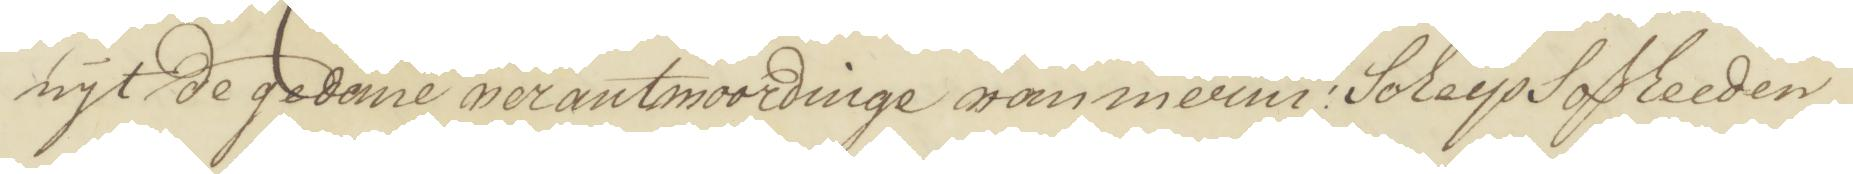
uijt de gedane verantwoordinge van meerm: scheeps overheeden
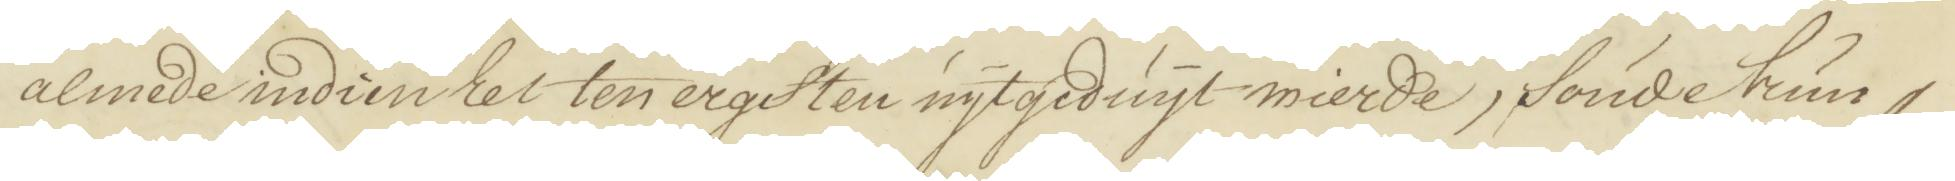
almede indien het ten ergsten uijtgeduijt wierde, soude kun„
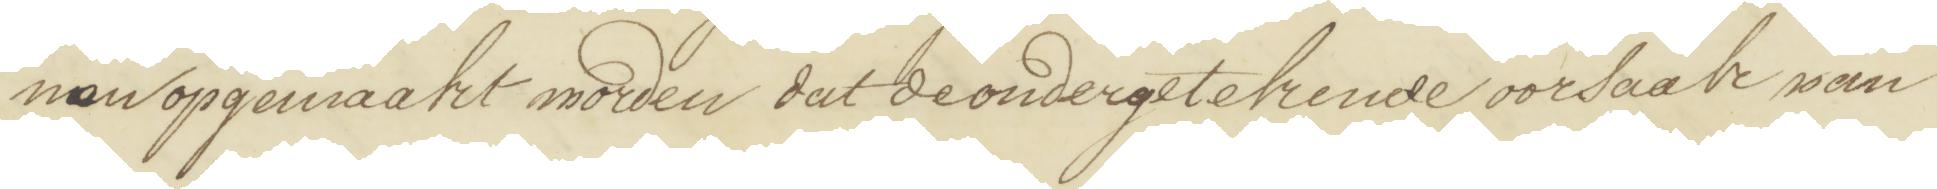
nen opgemaakt worden dat de ondergetekende oorsaak van
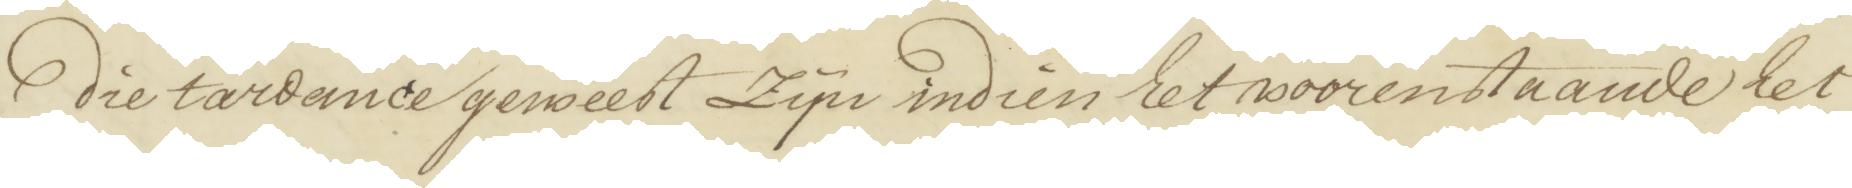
die tardance geweest zijn indien het voorenstaande het
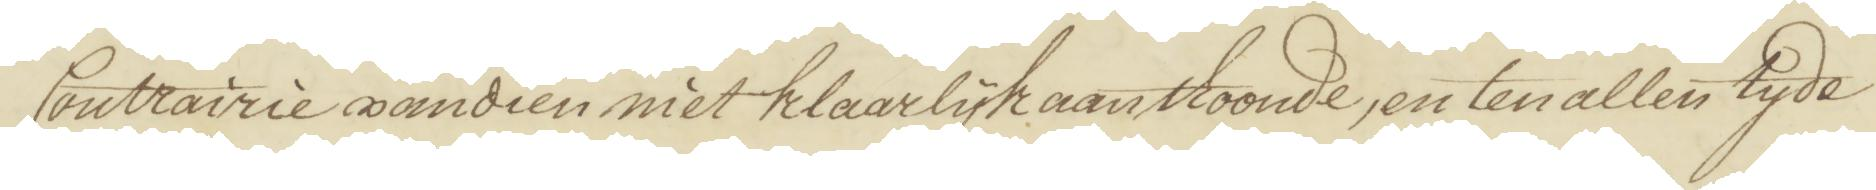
Contrairie vandien niet klaarlijk aanthoonde, en ten allen tyde
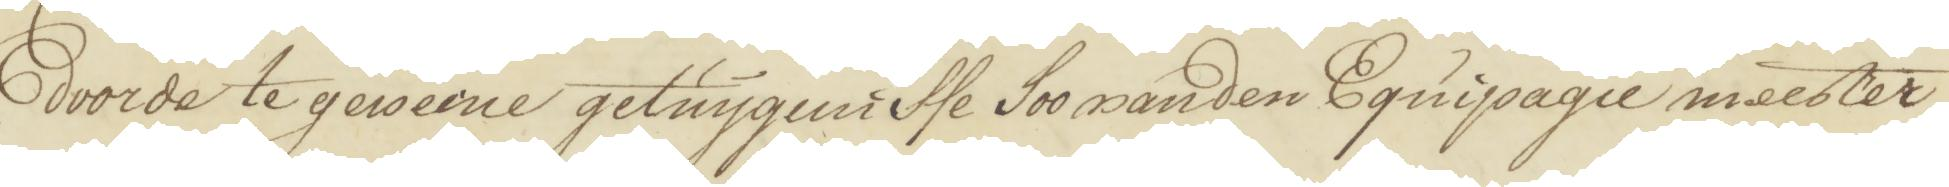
door de te gevene getuijgenisse soo van den Equipagie meester
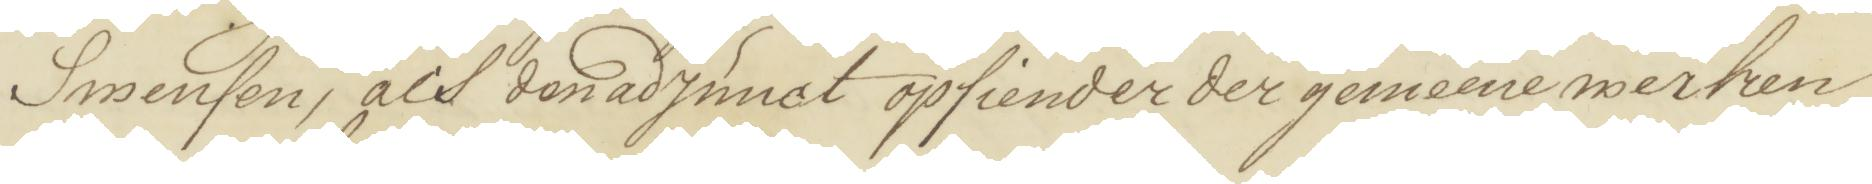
Swensen, als den adjunct opsiender der gemeene werken
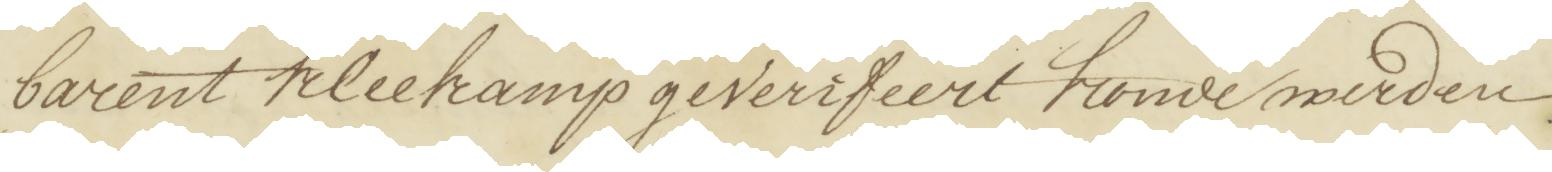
barent kleekamp geverifeert konde werden
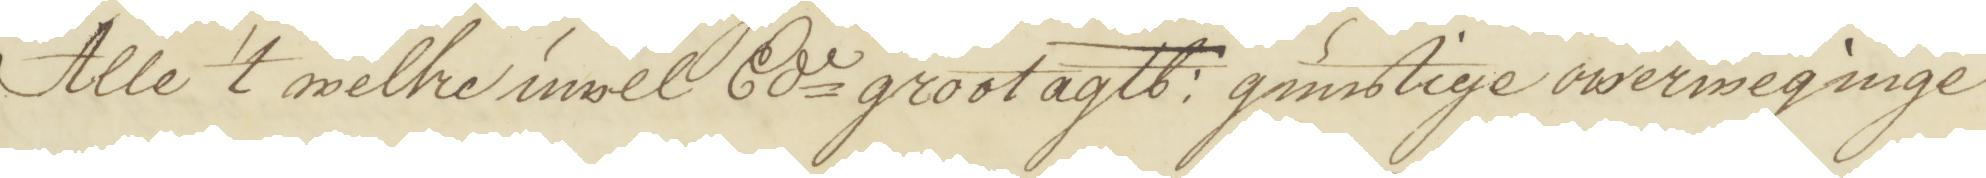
Alle ’t welke uwel Ed=e groot agtb: gunstige overweginge
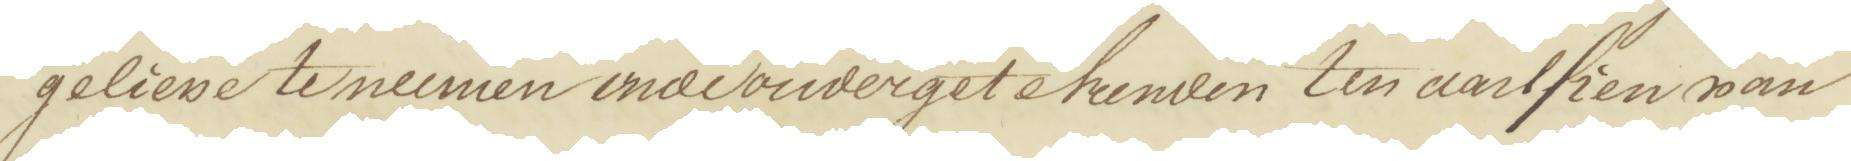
gelieve te neemen ende ondergetekenden ten aansien van
